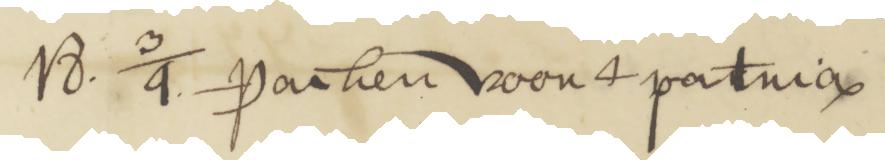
18.¾ packen voor t patria
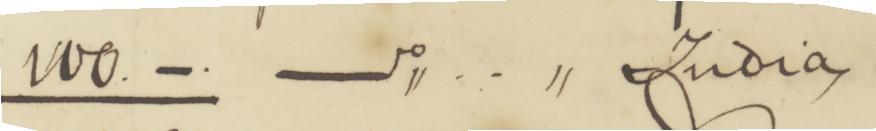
100. –. _„o . . „ India
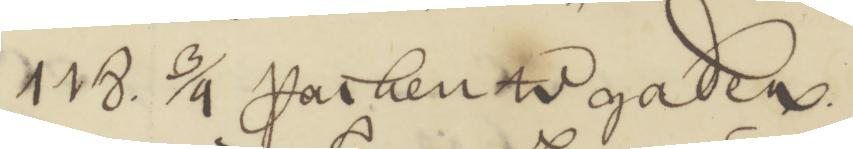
118.¾ packen te gader
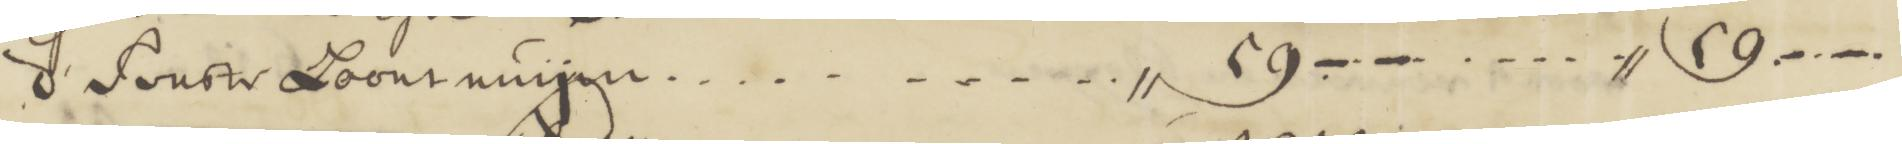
d’ Eerste zoort ruijm . . . . . . . . . . „ 59 - . - . . . . . „ 59.—.—.
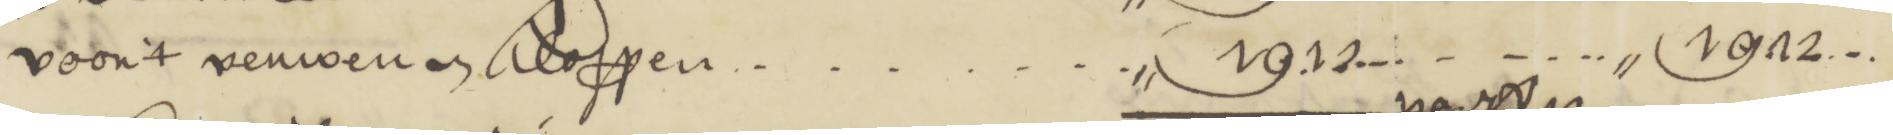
voor ’t verwen en kloppen . . . . . . „ 1912 . . . . . . . „ 1912.-.
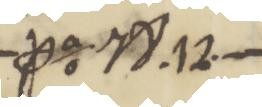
p a/o 78.12.-
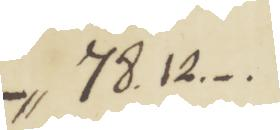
„ 78.12.—.
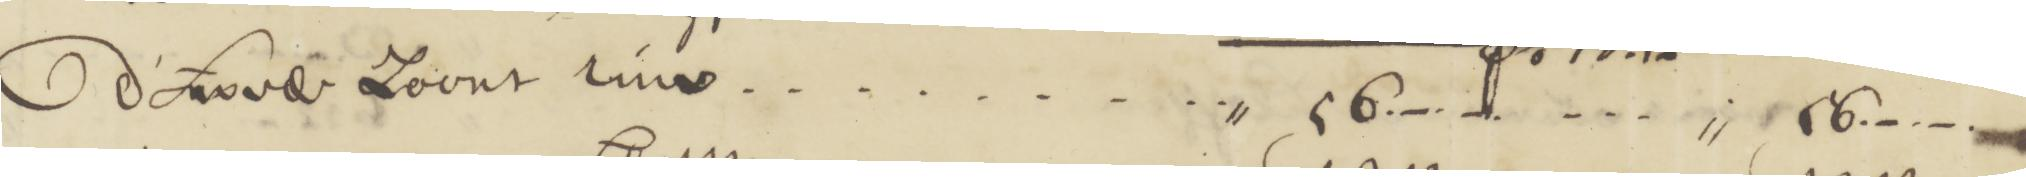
d' tweede zoort ruw . . . . . . . . . „ 56.—.—. . . . „ 56.—.—.—.
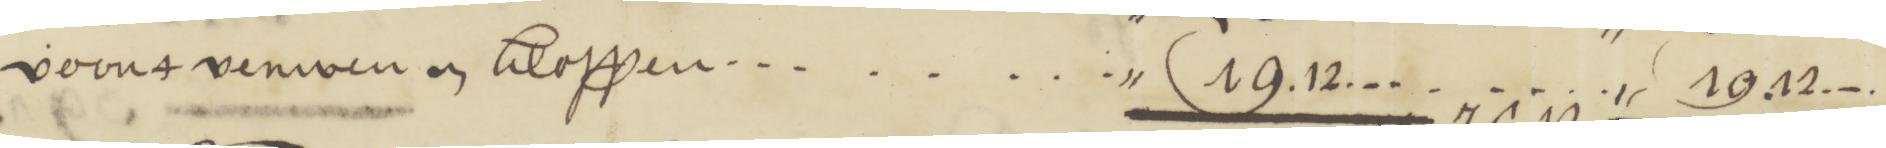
voort verwen en kloppen . . . . . . . . „ 19.12. . . . . . . . „ 19.12.—
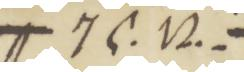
„ 75.12.
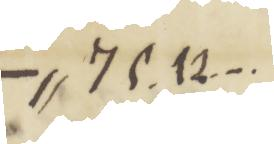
„ 75.12.—.
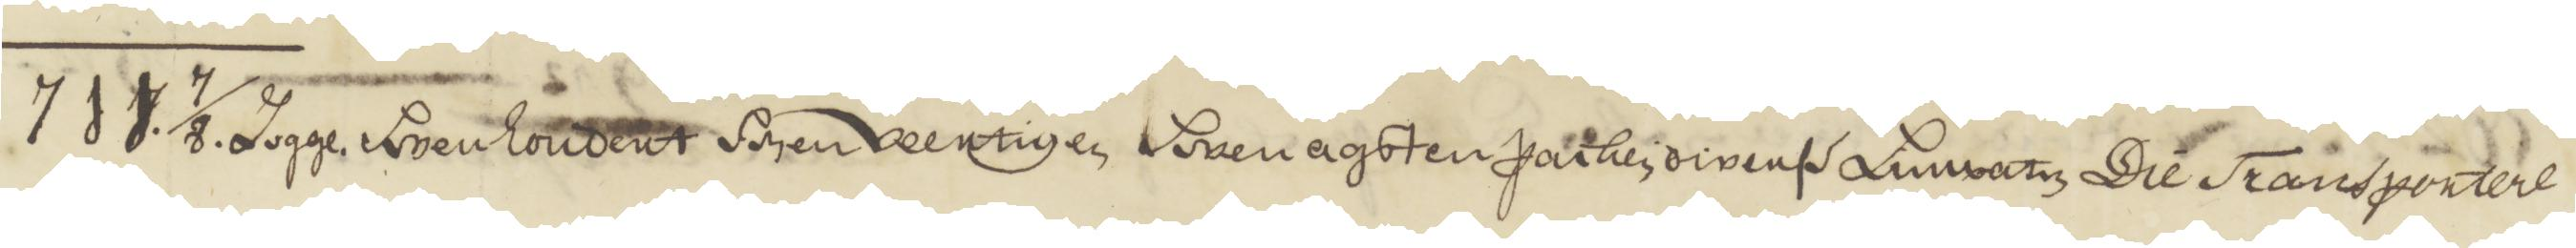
747.7/8. Zegge seven hondert seven veertigen seven agsten packen diverse Luwaten Die Transportere
